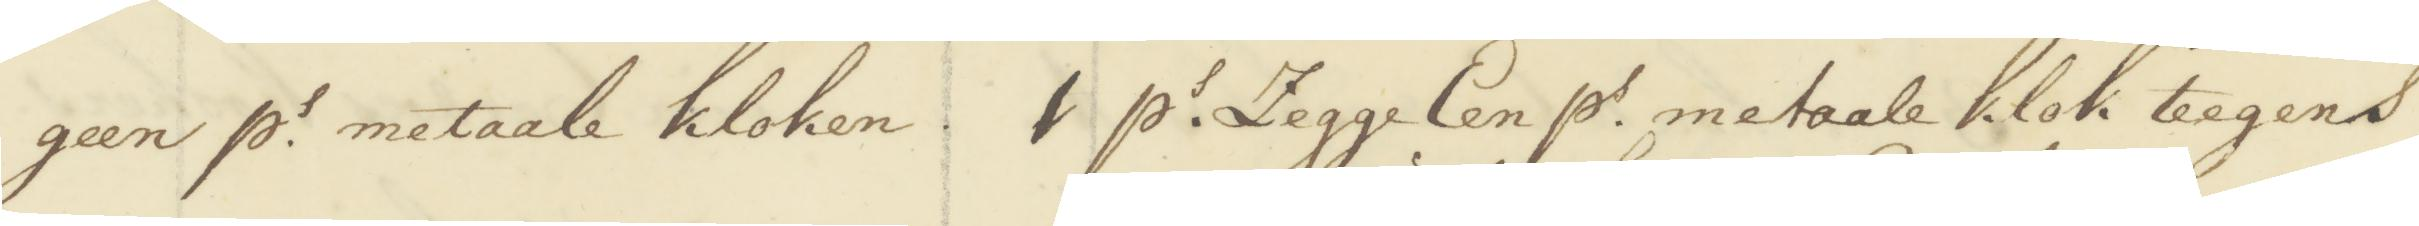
geen p.s metaale kloken. 1 p.s Zegge Een p.s metaale klok teegens
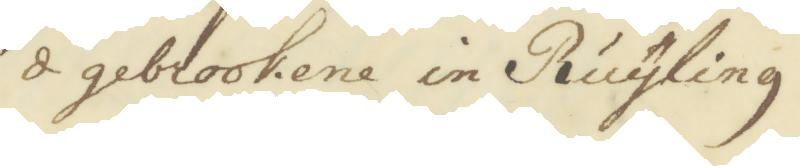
d' gebrookene in Ruijling
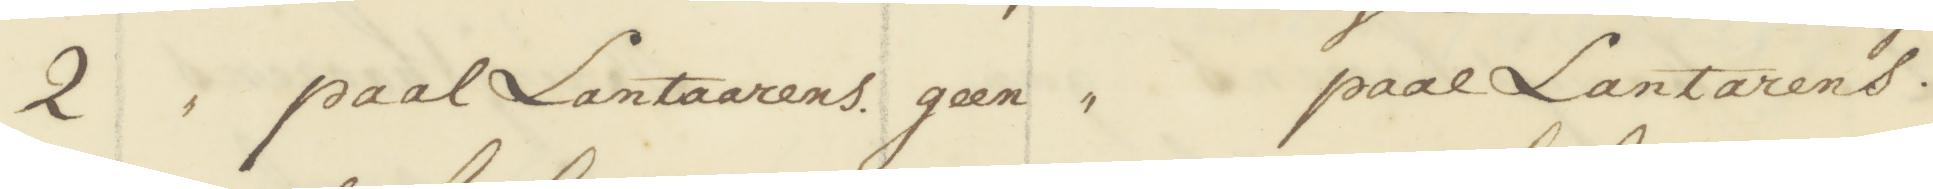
2 „ paal Lantaarens. geen „ paal Lantarens
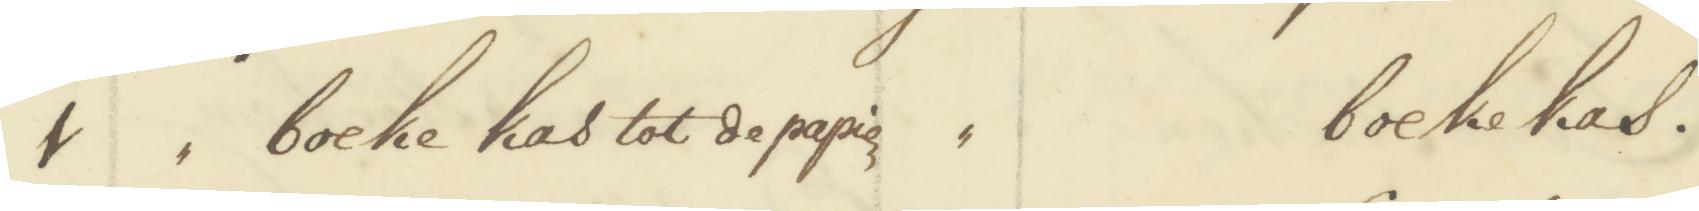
1 „ boeke kas tot de papier „ boeke kas.
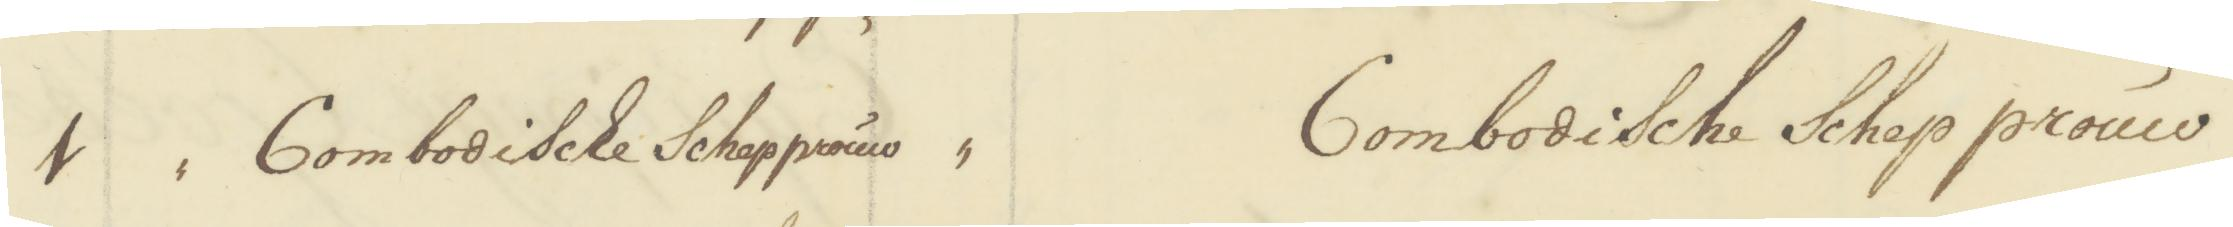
1 „ Combodische schepprouw „ Combodische schep prouw
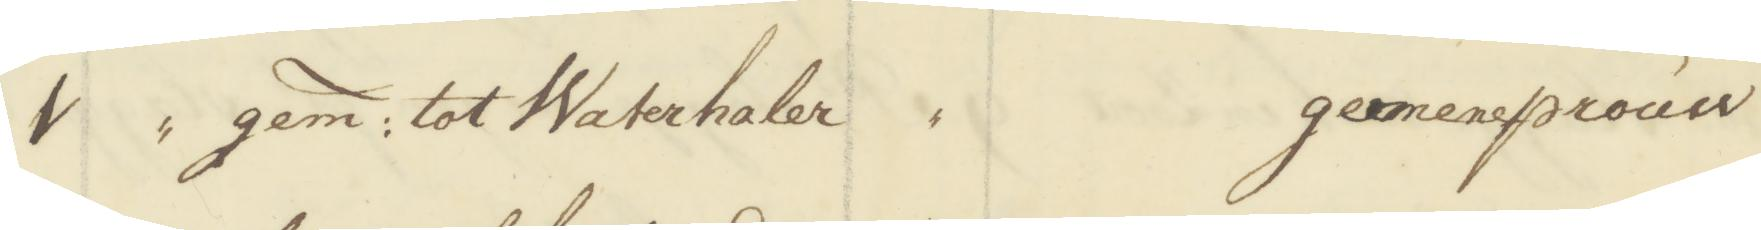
1 „ gem: tot Waterhaler „ gemeneprouw
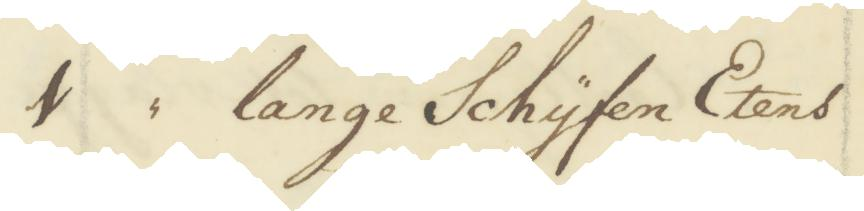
1 „ lange schijfen Etens
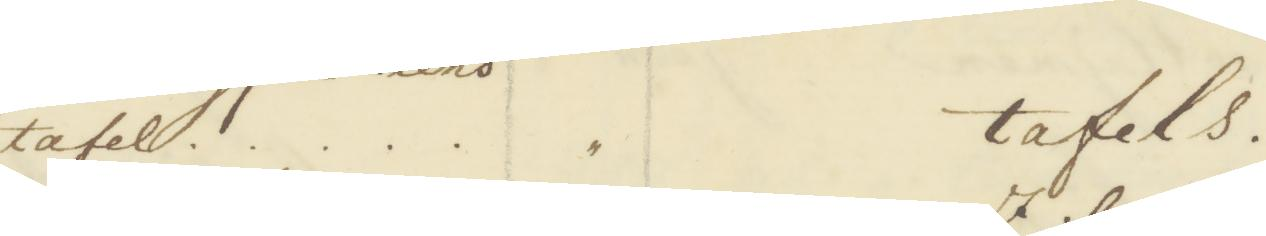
tafel . . . . . „ tafels
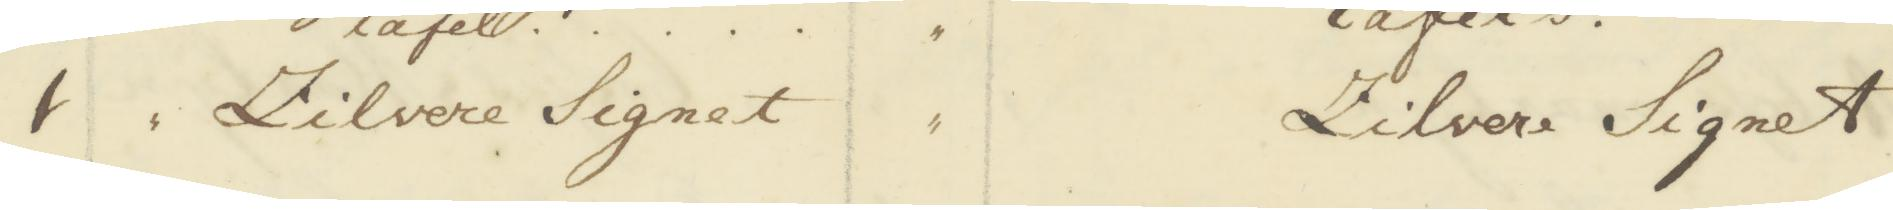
1„ Zilvere signet „ Zilvere signet
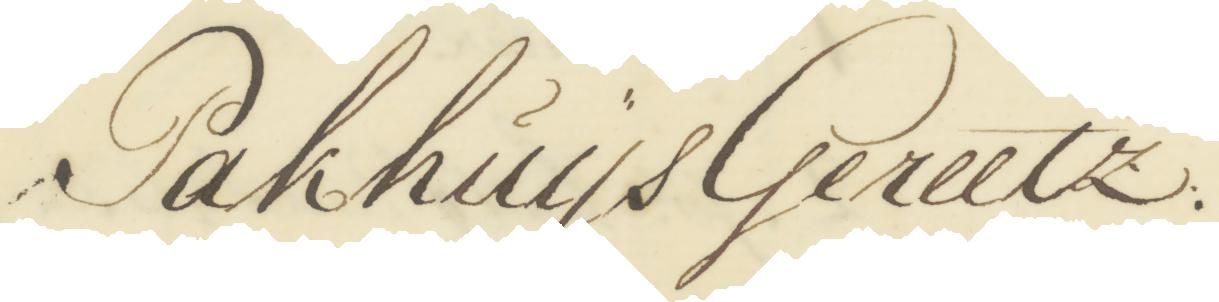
Pakhuijs Gereetz:
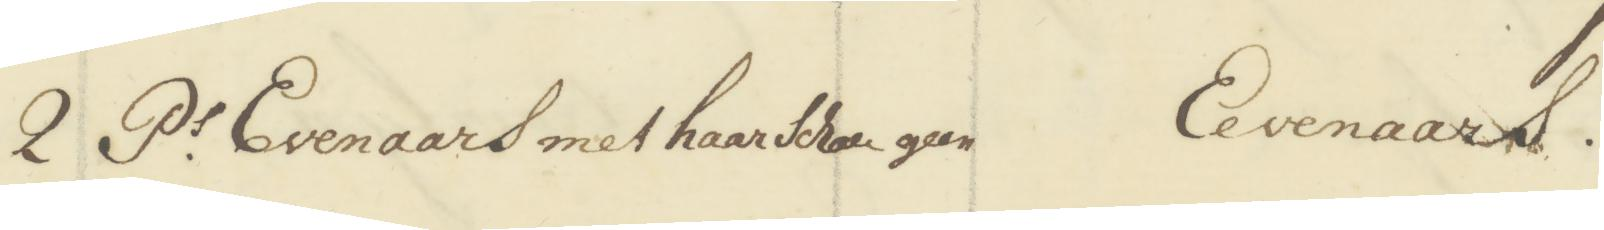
2 P.s Evenaars met haar schoen geen Eevenaars
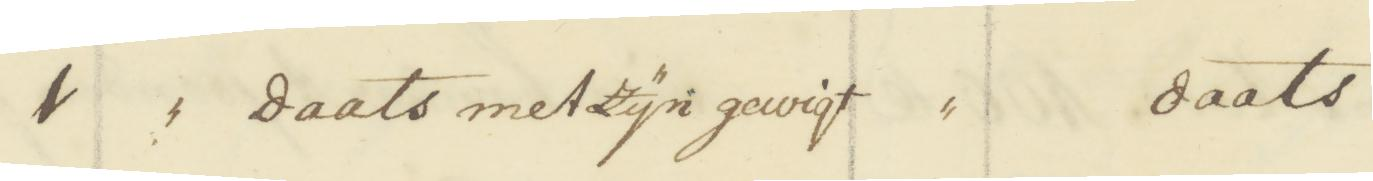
1 „ daats met zijn gewigt „ daats
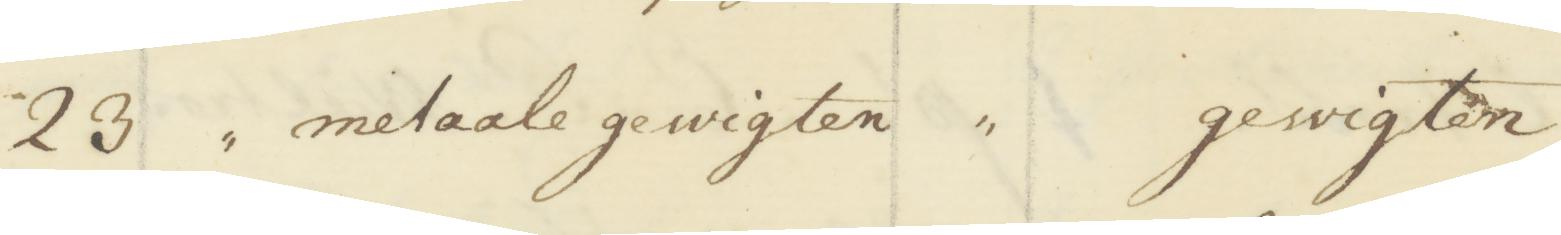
23 „ metaale gewigten „ gewigten
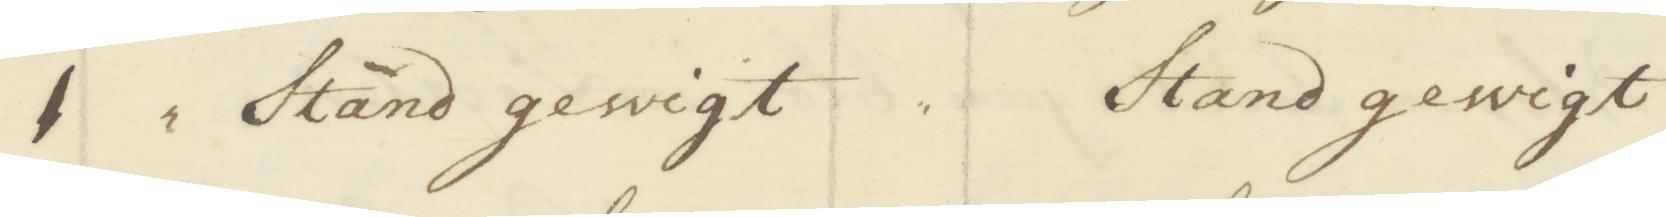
1 „ stand gewigt stand gewigt
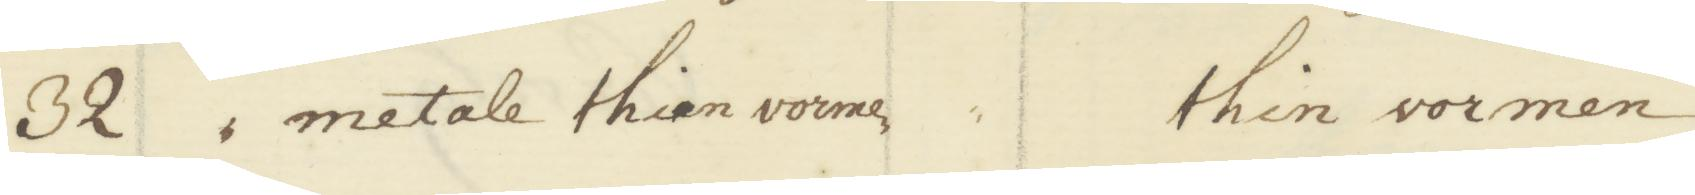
32 „ metale thien vormer „ thin vormen
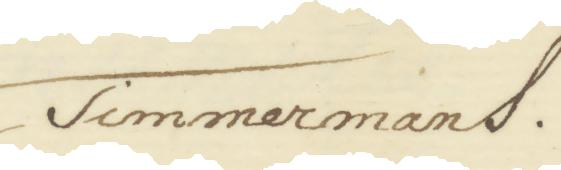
Timmermans.
